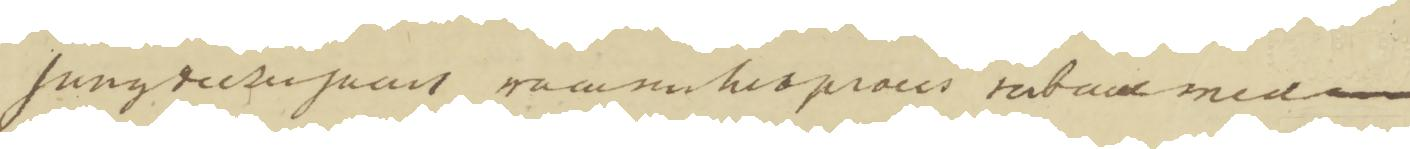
Juny deezes Jaars waar nu het proces verbaal mede
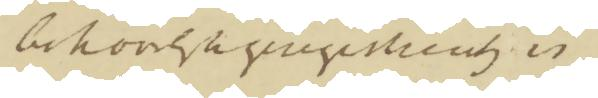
behoorlyk geregistreert is
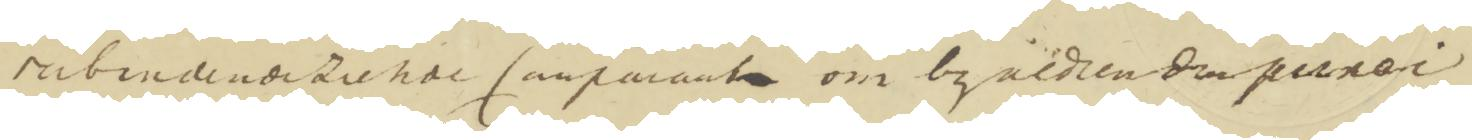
verbindende zich de Comparant om by aldien den pirrei
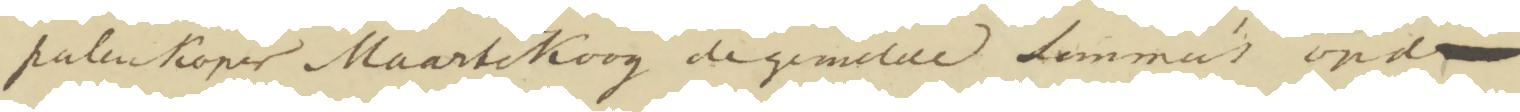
palenkoper Maarte Koog de gemelde somma's op de
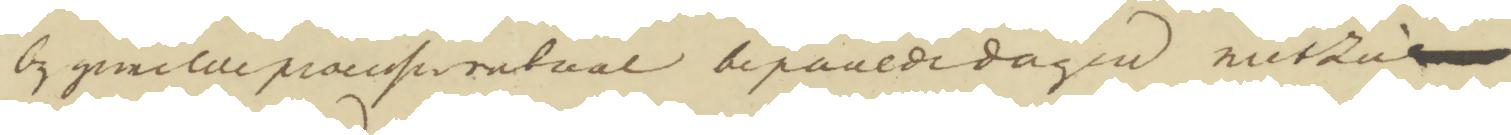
by gemelde procesverbaal bepaalde dagen niet zal
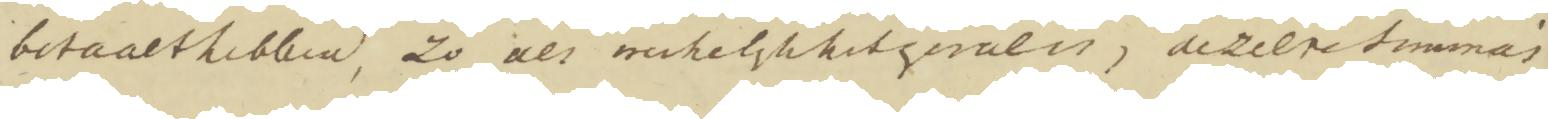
betaalt hebben, zo als werkelyk het geval is, dezelve somma's
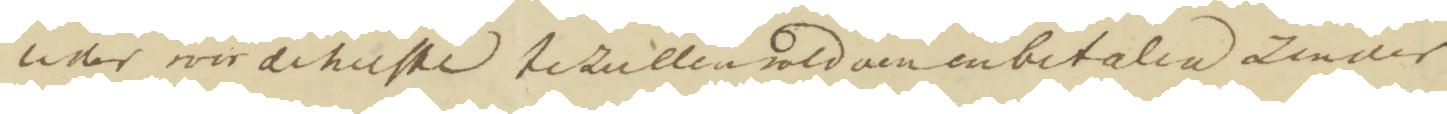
ieder voor de helfte te zullen voldoen en betalen zonder
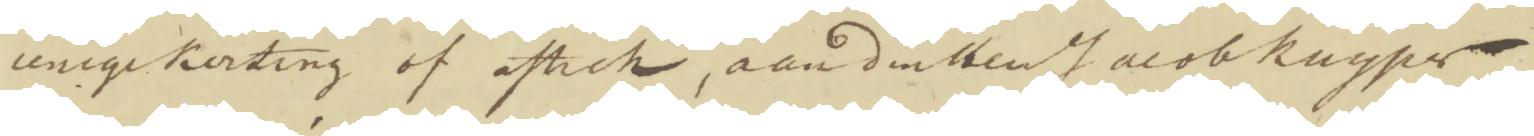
eenige korting of aftrek, aan den Hen Jacob Kuyper
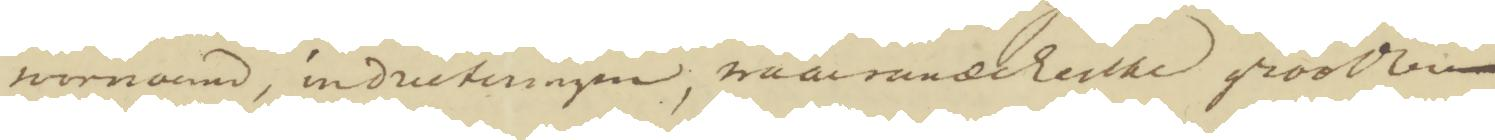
voornoemd, in drie termyn, waarvan de Eerste groot Een
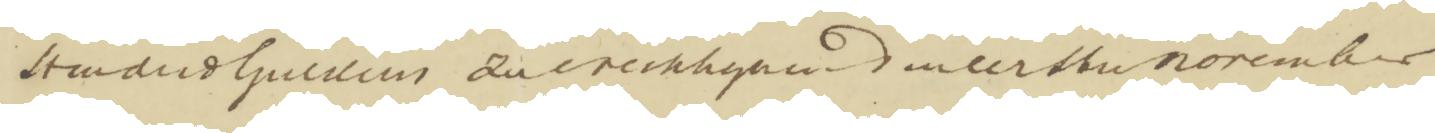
Honderd Guldens zal verschynen den eerste november
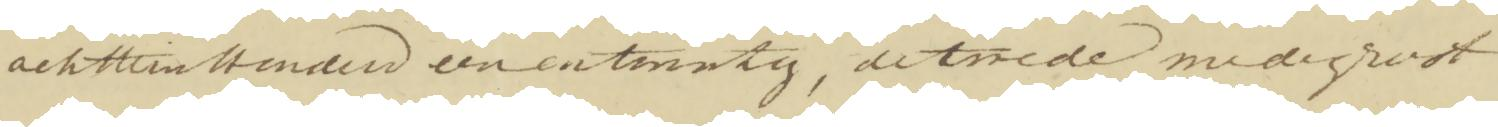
achttien Honderd een en twintig, de twede mede groot
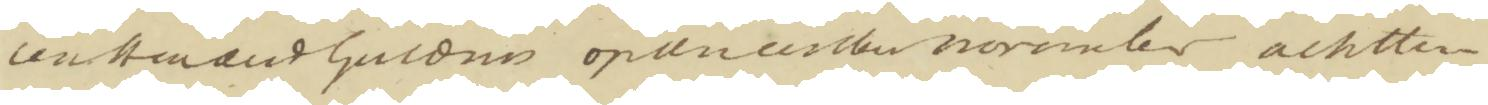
een honderd Guldens op den eersten november achtten
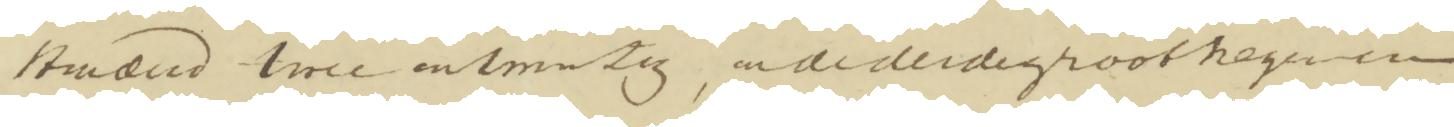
honderd twee en twintig, ende derde groot negen en
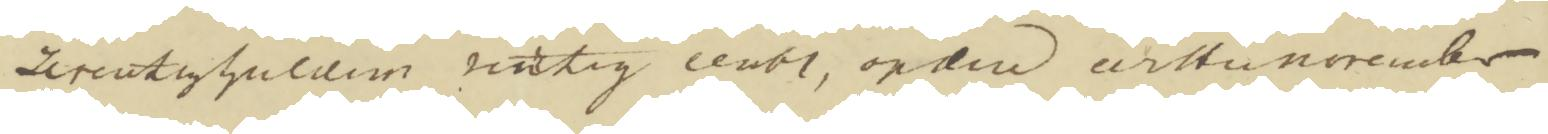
zeventig Guldens veertig cents, op den eersten november
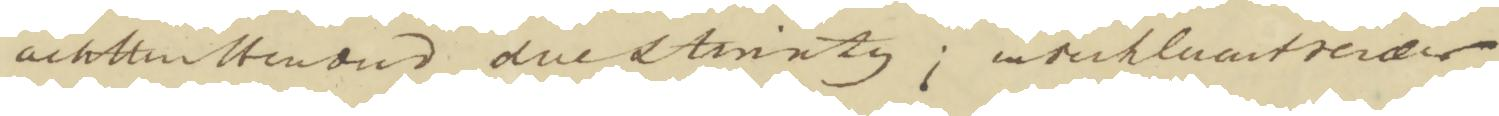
achttin honderd drie & twintig; en verklaart verder
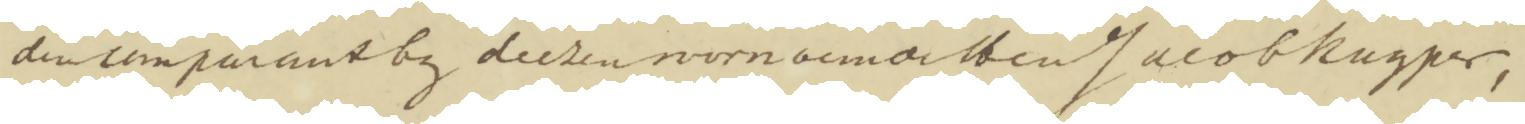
den comparant by deezen voornoemde Hen Jacob Kuyper,
